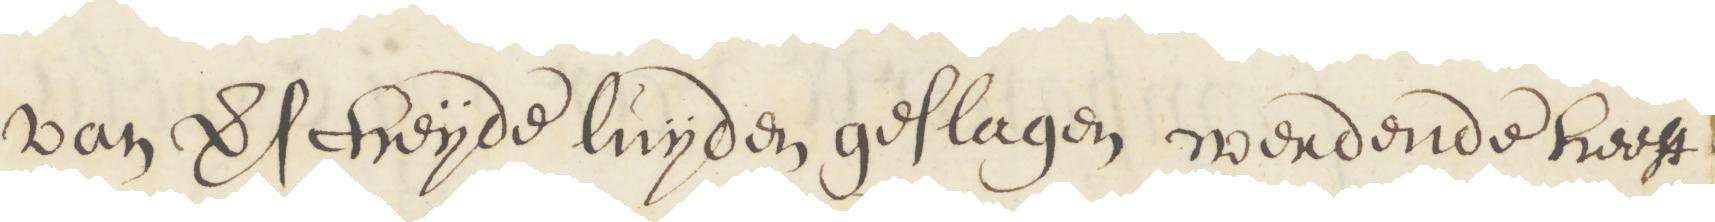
van verscheijde luijden geslagen werdende heeft
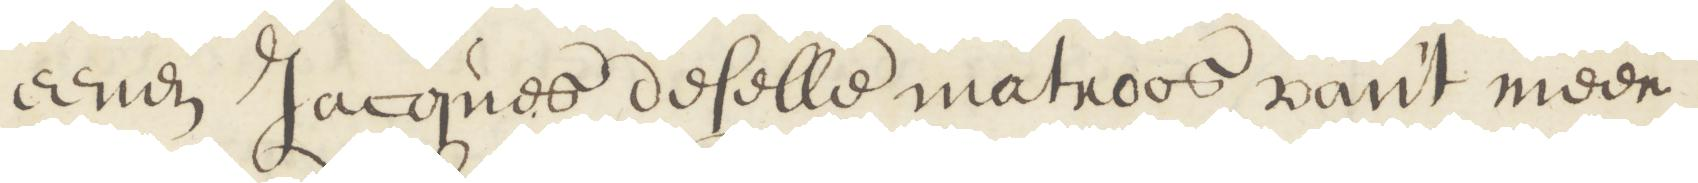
eenen Jacques deselle matroos van’t meer
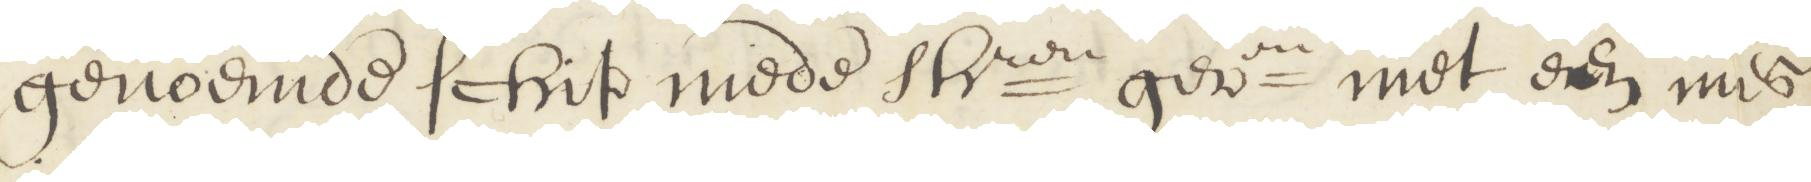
genoemde schip mede sh=ren gev=en met een mes
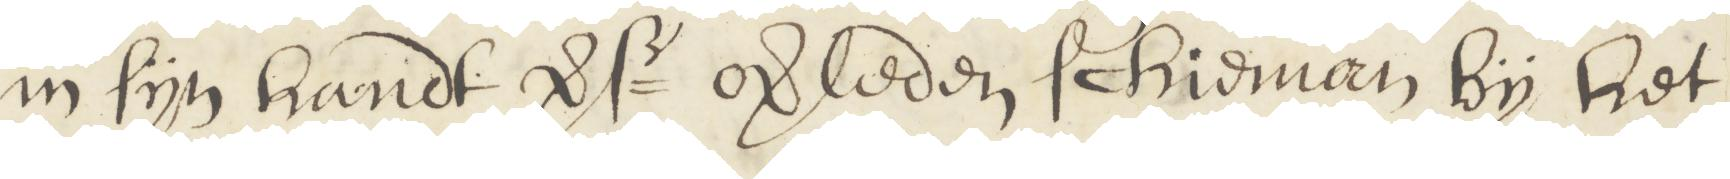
in sijn handt vers=z overleden schieman bij het
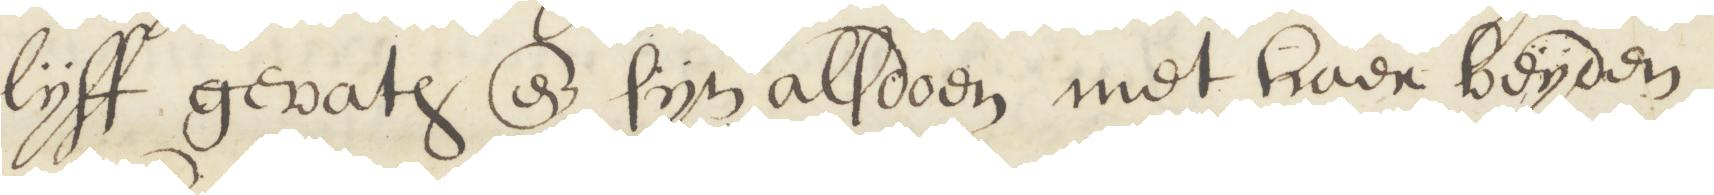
lijff gevath ende sijn alsdoen met haer beijden
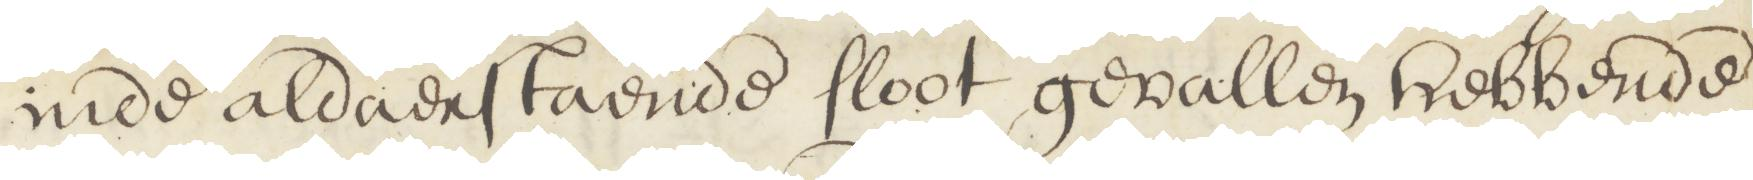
inde aldaerstaende sloot gevallen hebbende
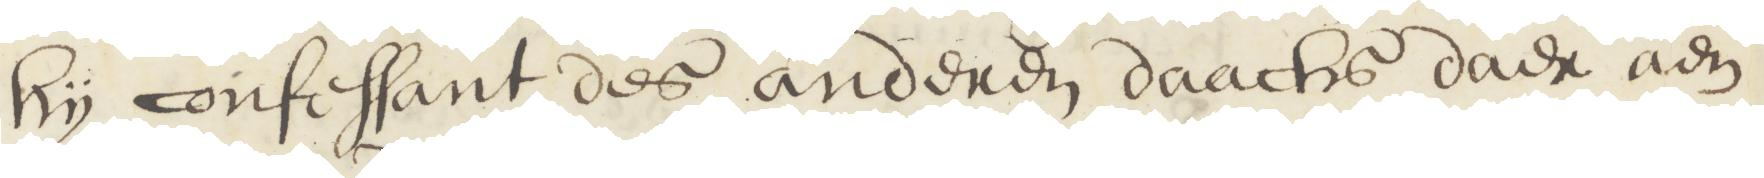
hij confessant des anderen daachs daer aen
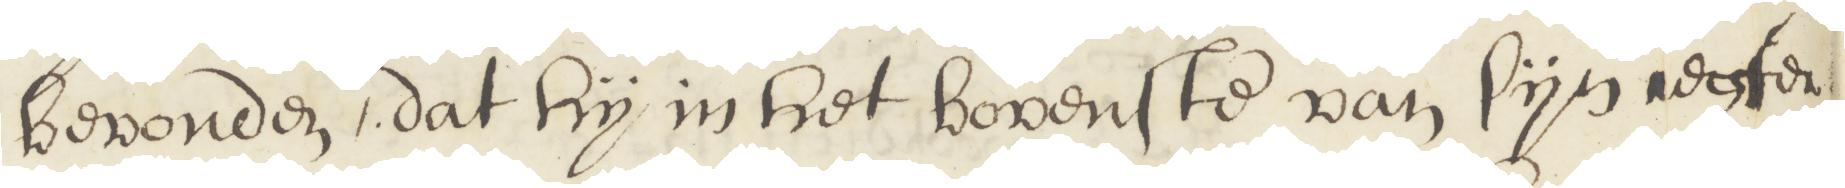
bevonden, dat hij in het bovenste van sijn rechter
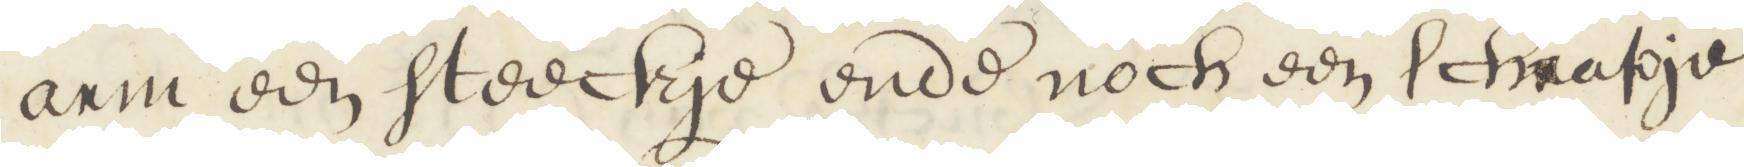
arm een steeckje ende noch een schrapje
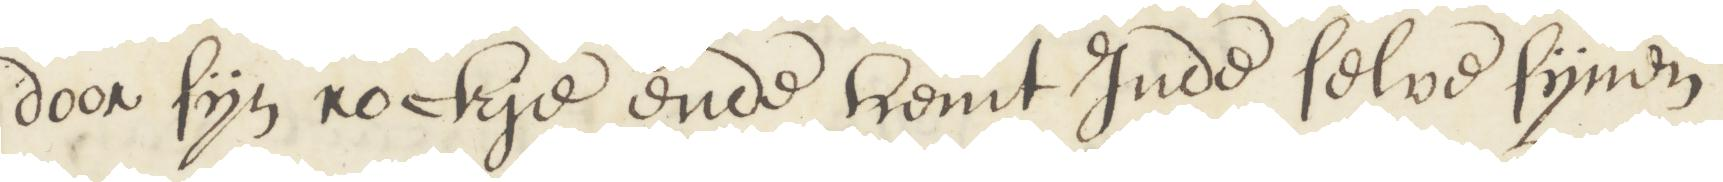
door sijn rockje ende hemt Jnde selve sijnen
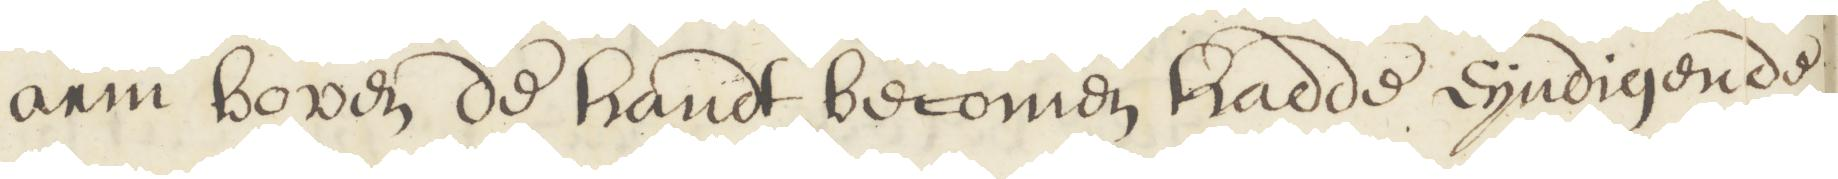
arm boven de handt becomen hadde eijndigende
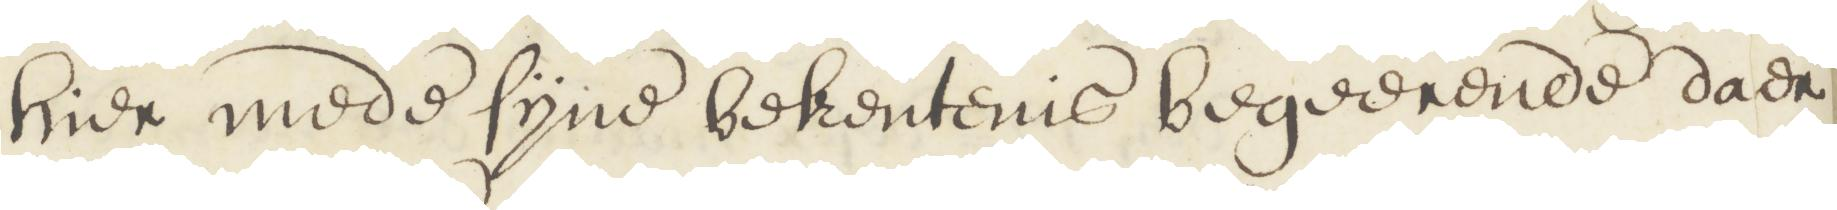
hier mede sijne bekentenis begeerende daer
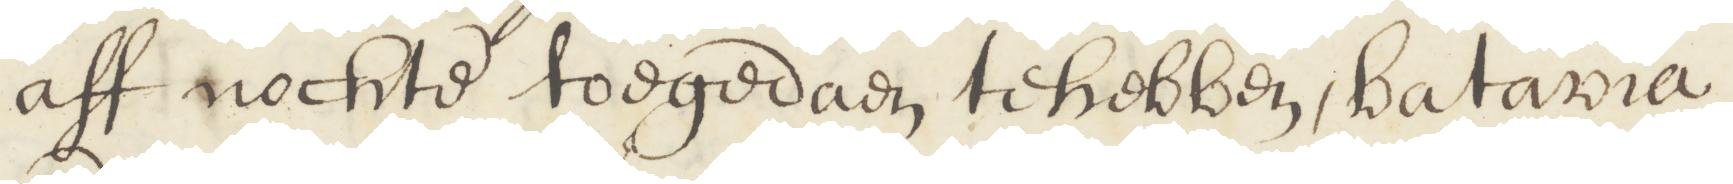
aff nochte toegedaen te hebben, batavia
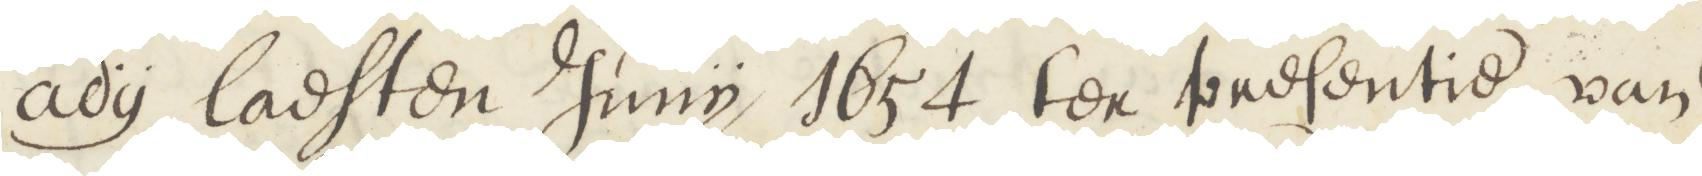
adij laesten Junij 1654 ter presentie van
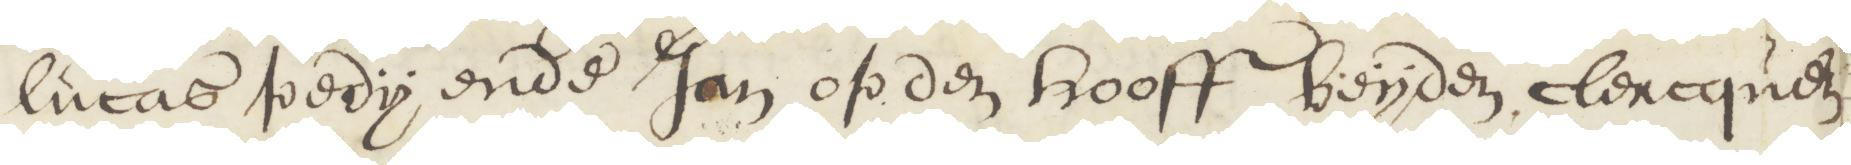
lucas pedij ende Jan op den hooff beijden clercquen
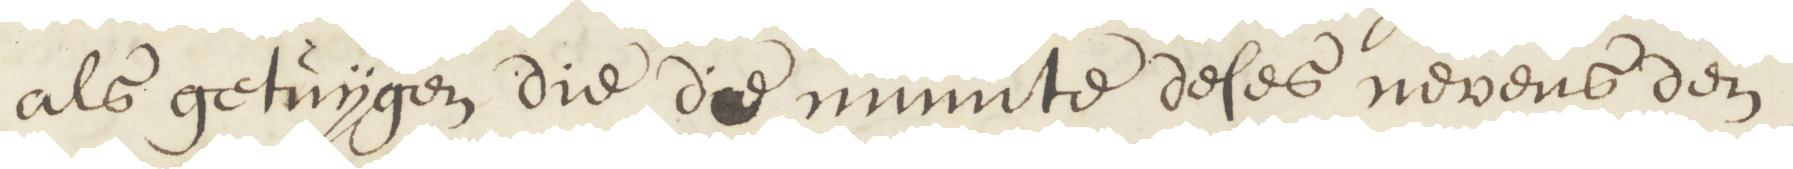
als getuijgen die de minute deses nevens den
